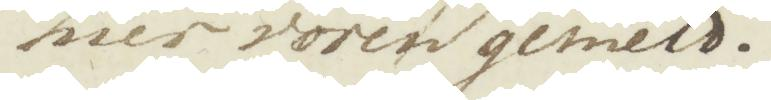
hier voren gemeld.
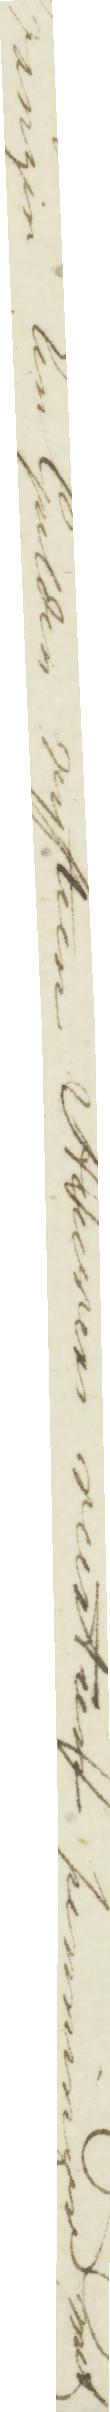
vangen Een Gulden vyftien stuivers veertien penningen met
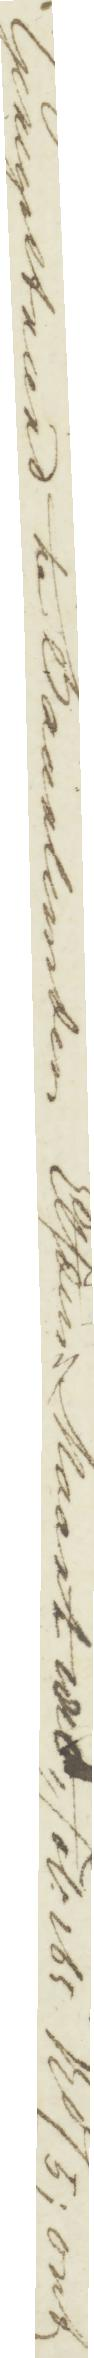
Geregistreerd te Haarlem den Elfden Maart 1818, fol. 165 RoC5; ont
